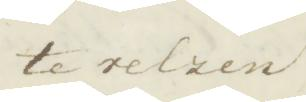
te velzen
